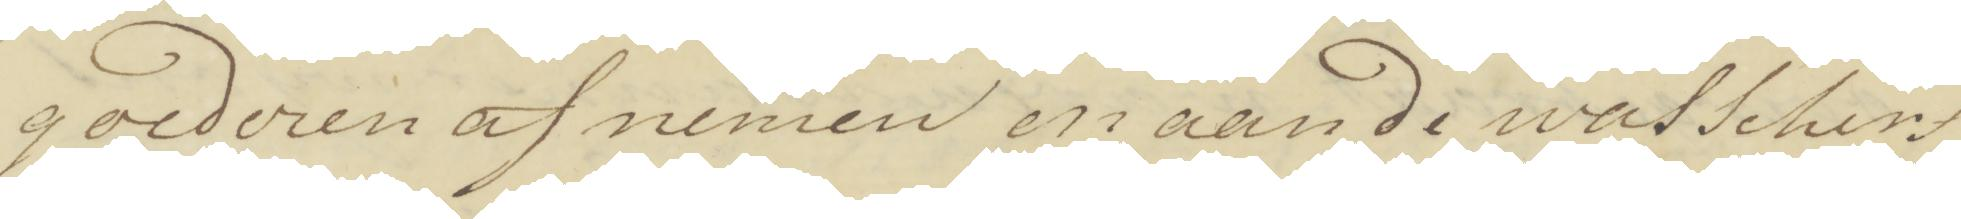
goederen afnemen en aan de wasschers
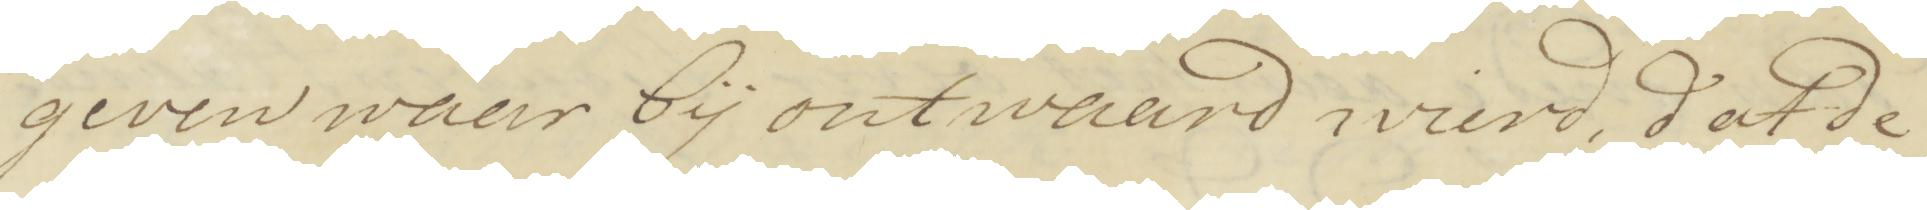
geven waar bij ontwaard wierd, dat de
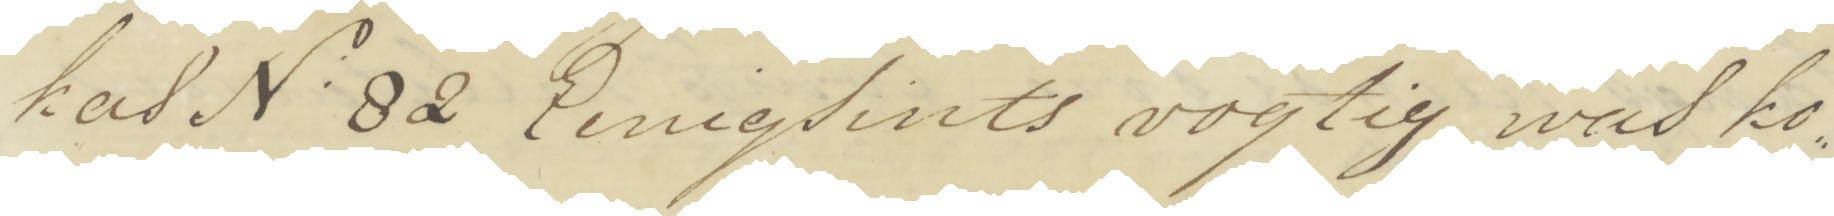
kas N:o 82 Eenigsints vogtig was ko„
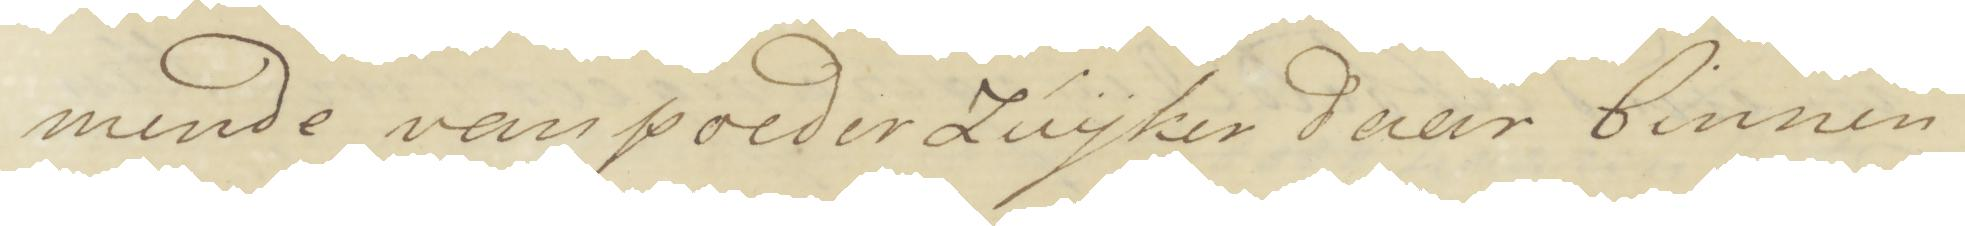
mende van poeder zuijker daar binnen
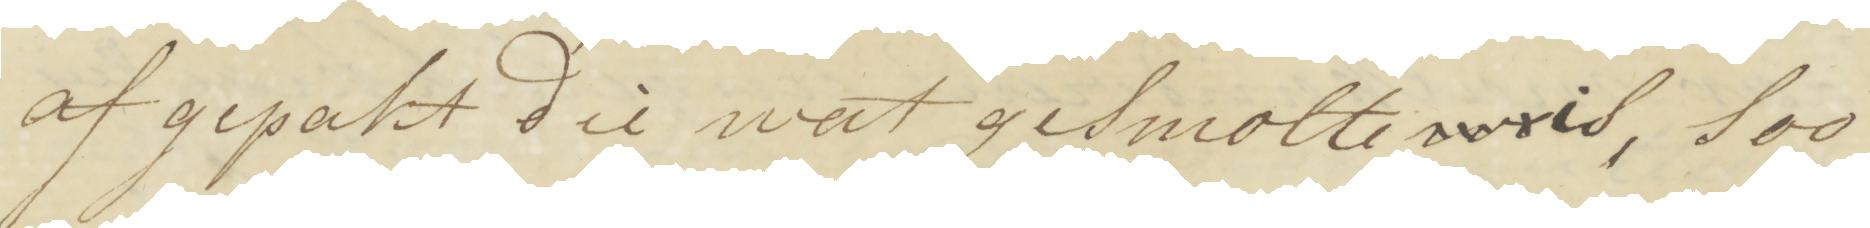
afgepakt die wat gesmolte is, soo
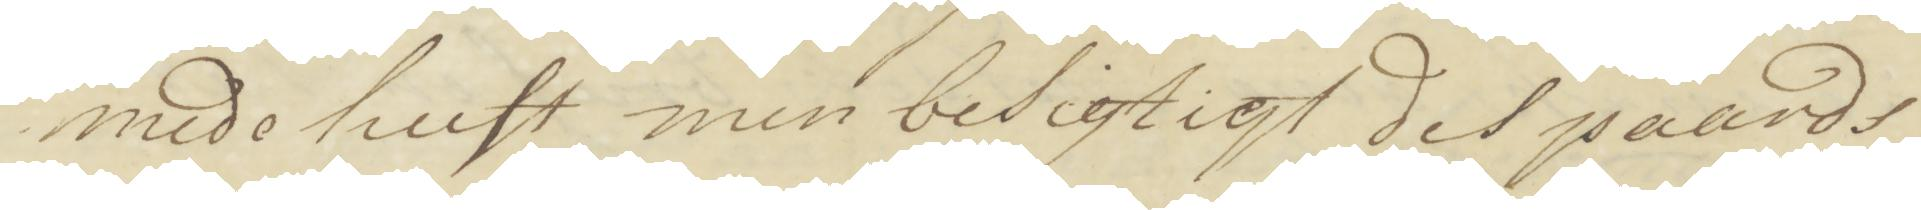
mede heeft men besigtigt des paards
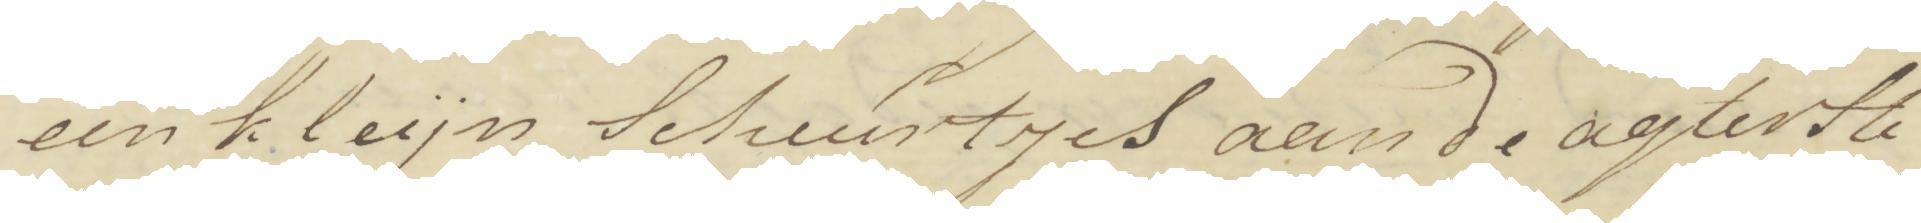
een kleijn scheurtjes aan de agterste
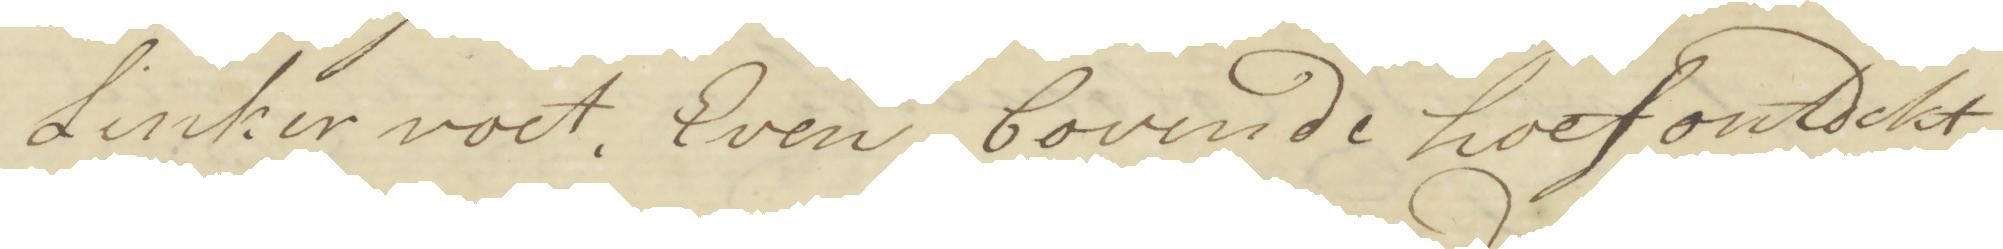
linker voet. Even boven de hoef ontdekt,
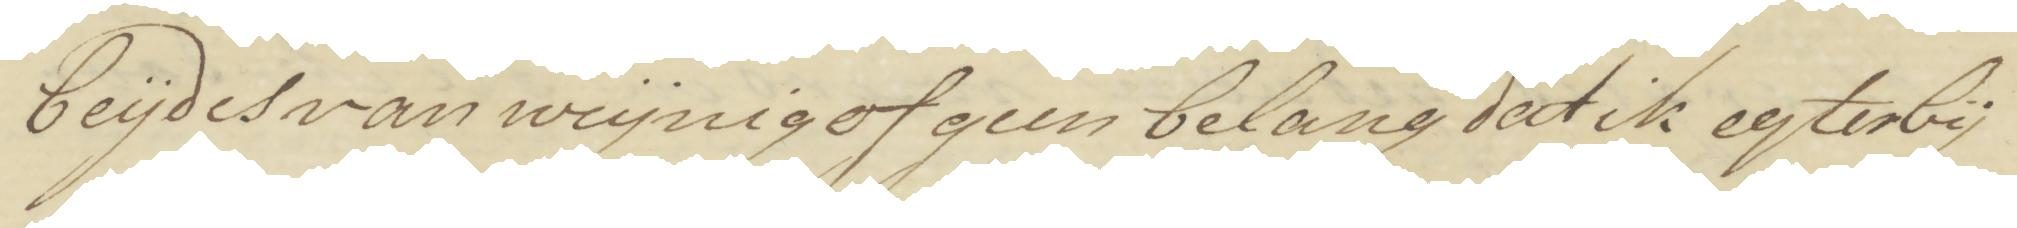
beijdes van weijnig of geen belang dat ik egterbij
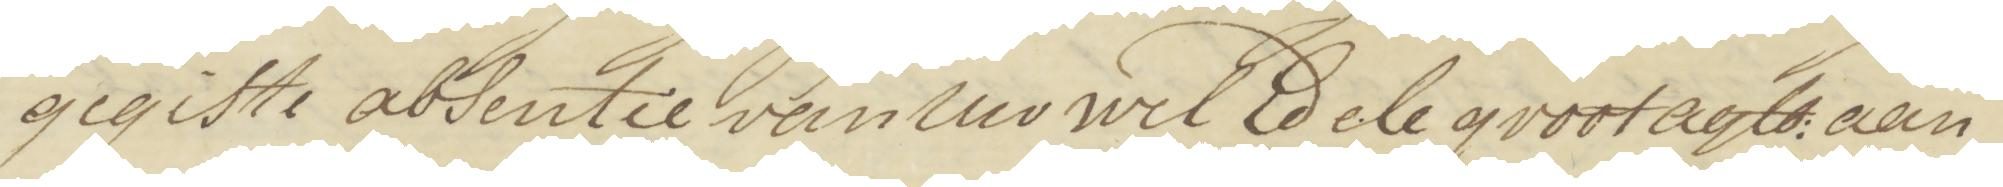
gegiste absentie van uw wel Edele groot agtb: aan
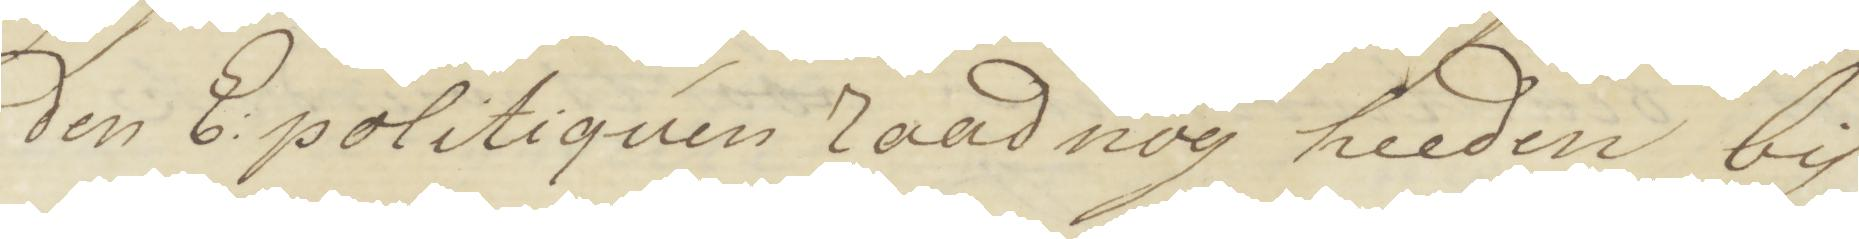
den E: politiquen raad nog heeden bij
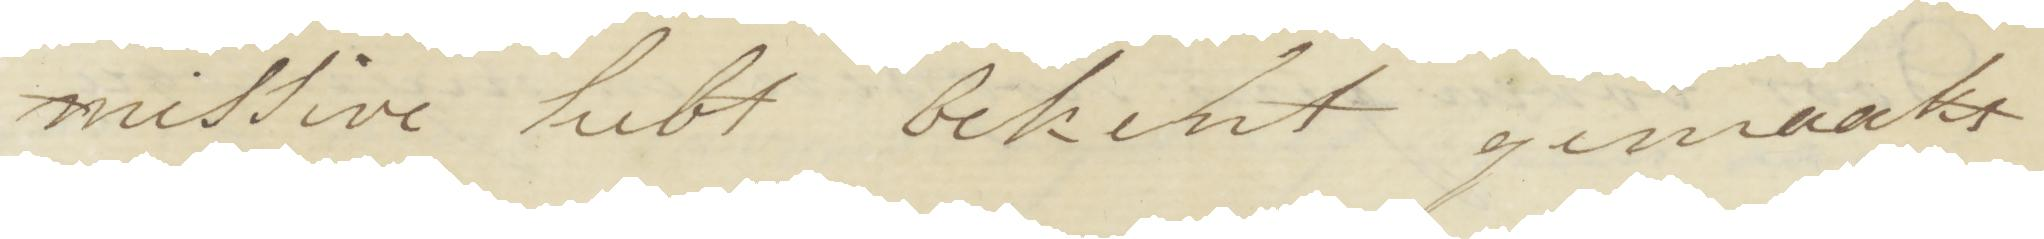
missive hebt bekent gemaakt
